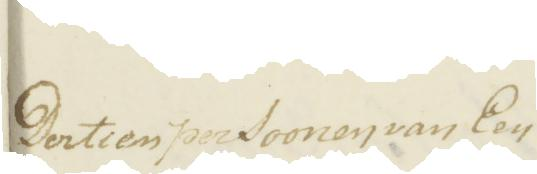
Dertien persoonen van Een
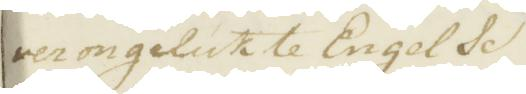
verongelukte Engelse
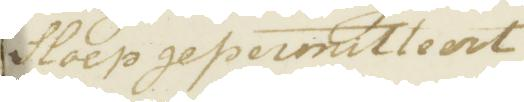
sloep gepermitteert
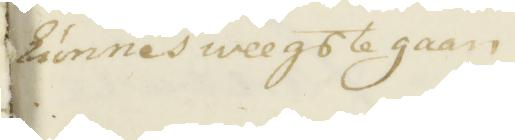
hunnes weegs te gaan.
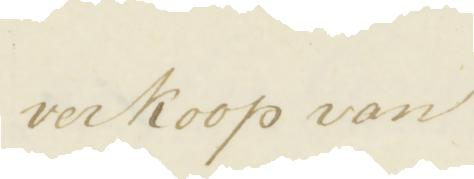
verkoop van
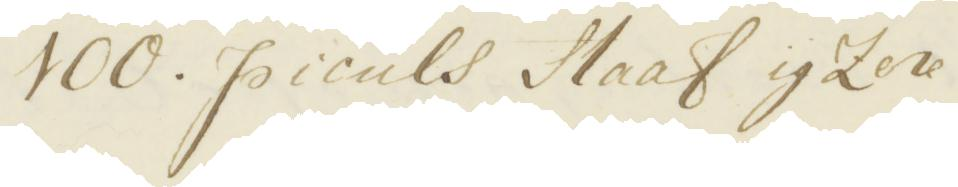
100. Piculs staaf ijzere
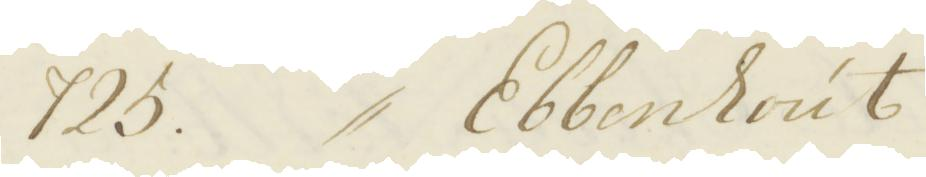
125. „ Ebbenhout
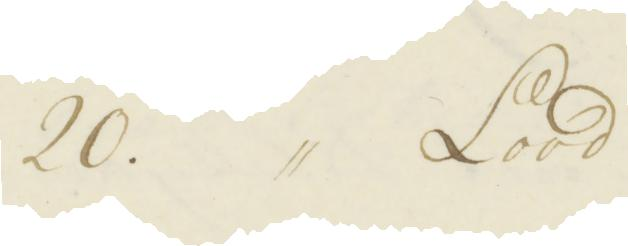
20. „ Lood
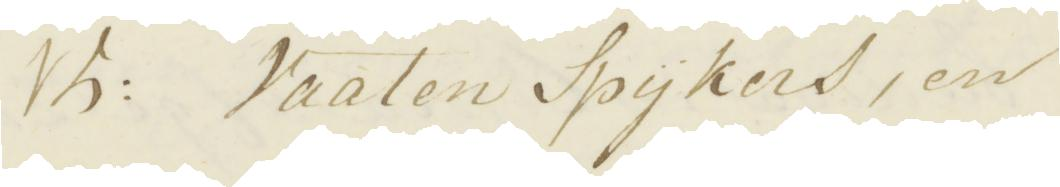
15: Vaaten spijkers, en
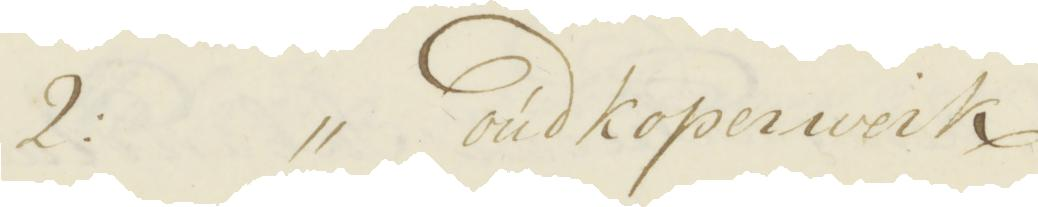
2: „ oud koperwerk
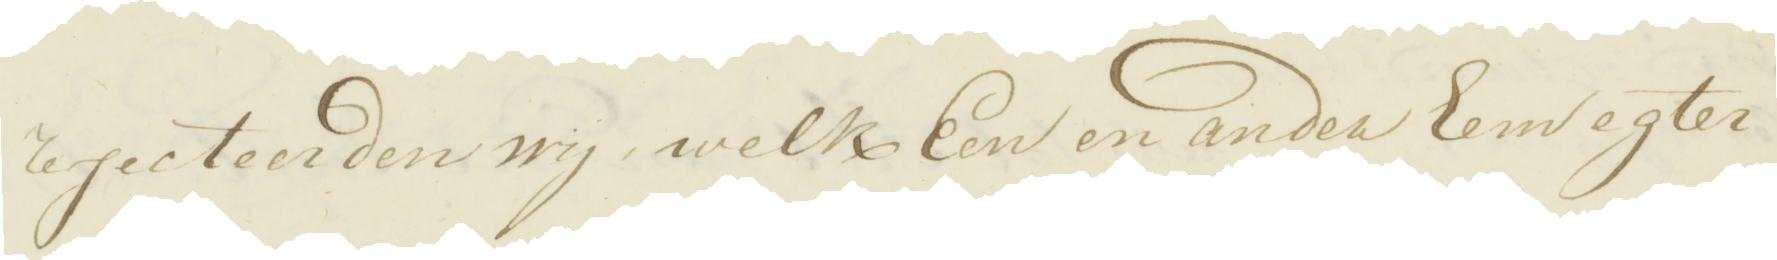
refecteerden wij, welk Een en ander hem egter
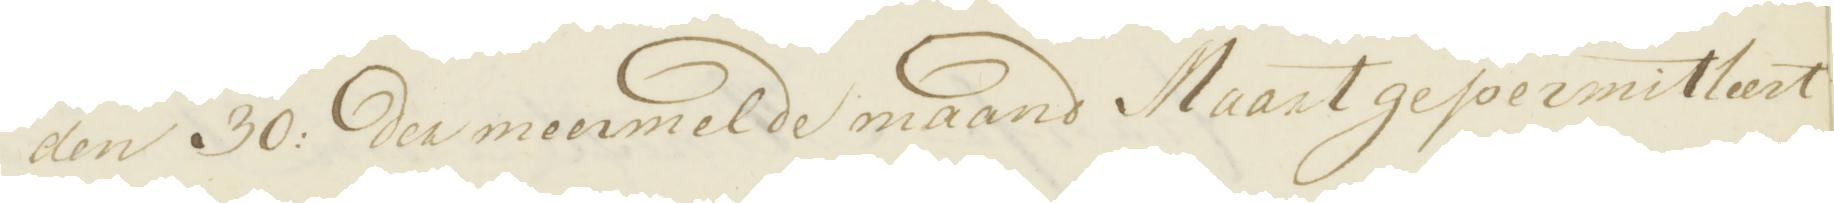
den 30: der meermelde maand Maart gepermitteert
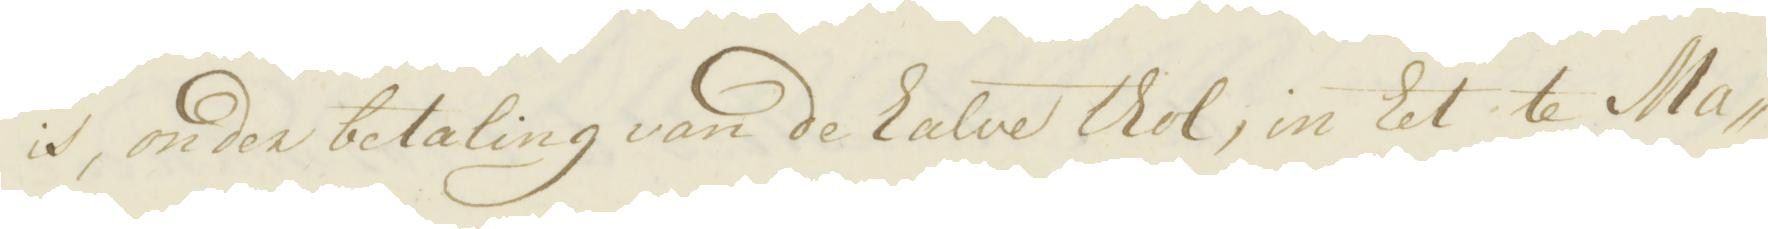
is, onder betaling van de halve thol, in het te Ma„
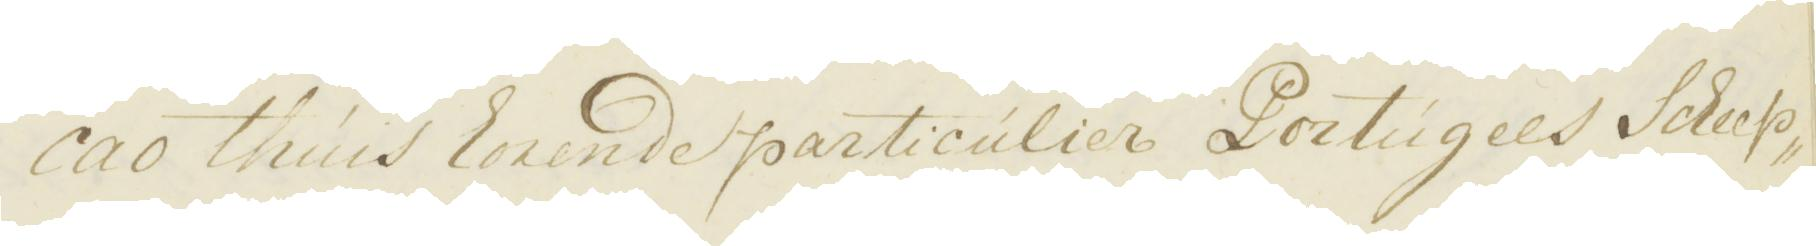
cao thuis horende particulier Portugees scheep„
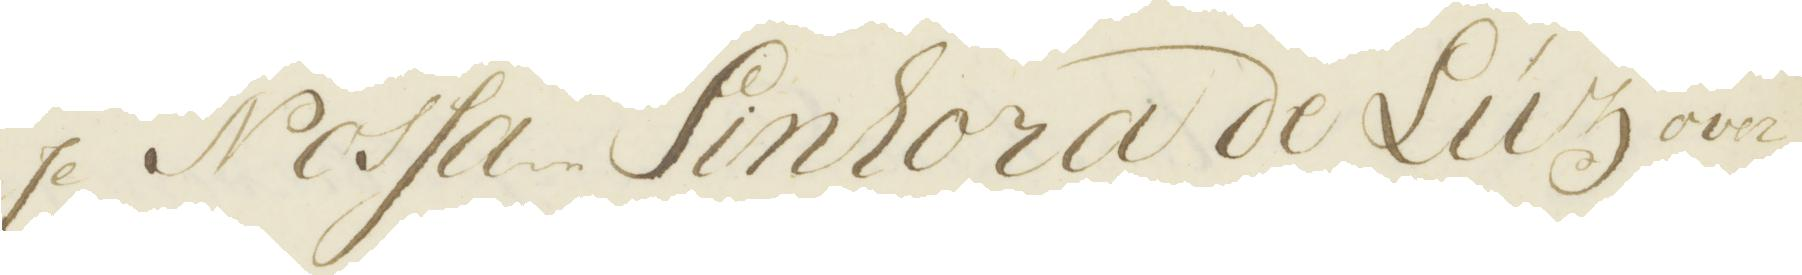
je Nossa Sinhora de Luz over
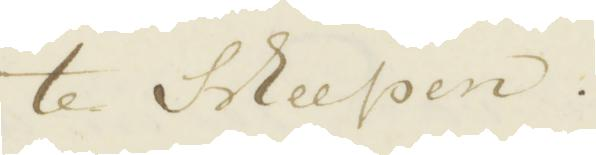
te scheepen.
